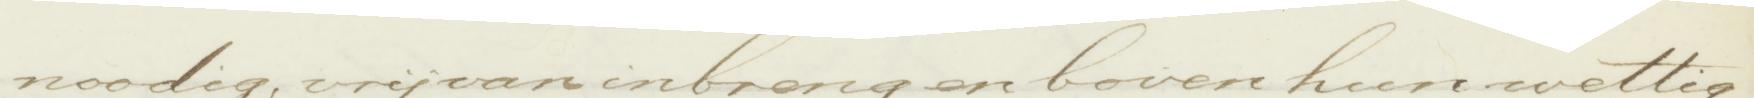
noodig, vrij van inbreng en boven hun wettig
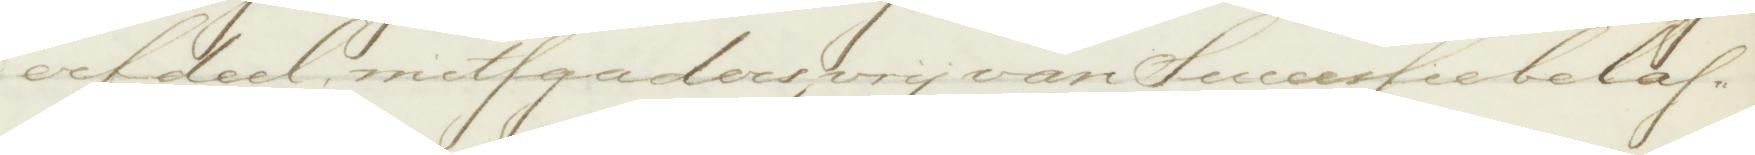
erfdeel, mitsgaders ,vrij van Successie belas„
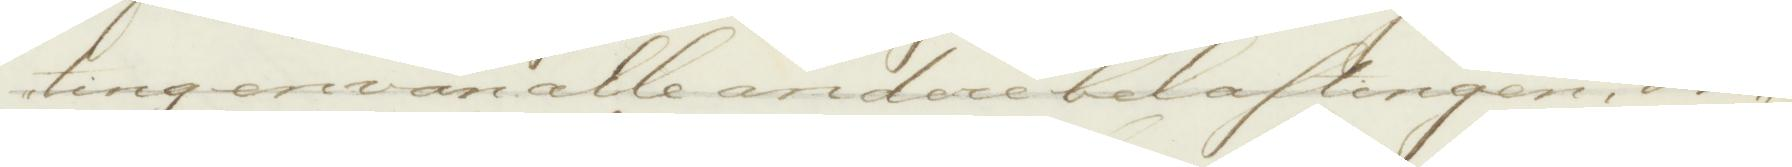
„ting en van alle andere belastingen, on„
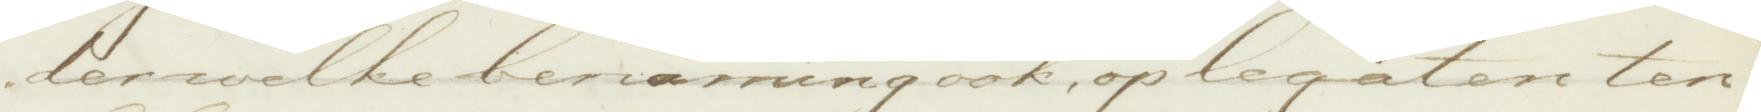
„der welke benaming ook, op legaten ten
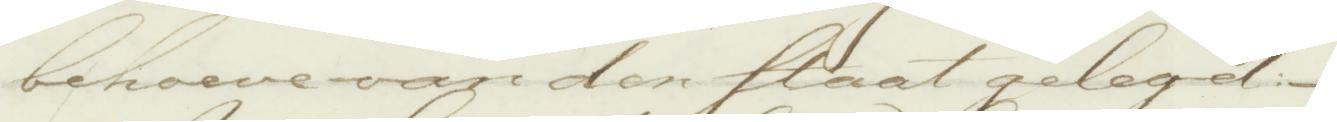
behoeve van den staat gelegd: —
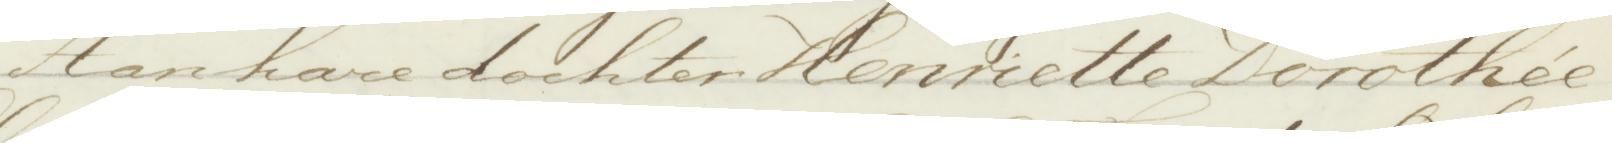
Aan hare dochter Henriette Dorothée
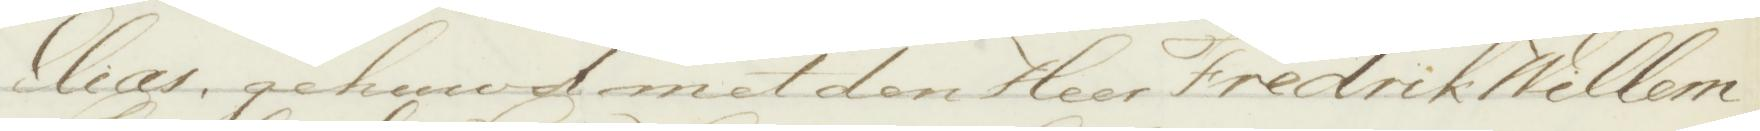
Elias, gehuwd met den Heer Fredrik Willem
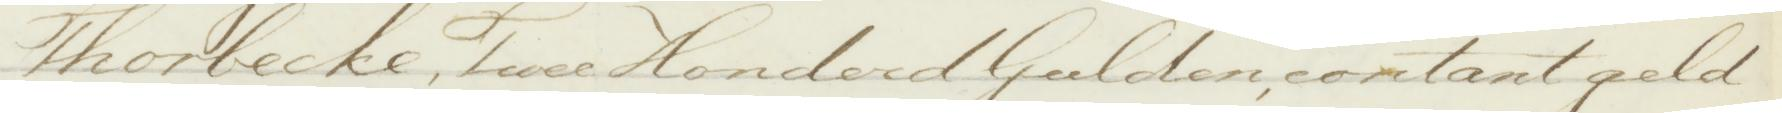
Thorbecke, Twee Honderd Gulden, contant geld
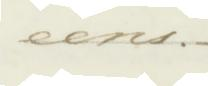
eens. —
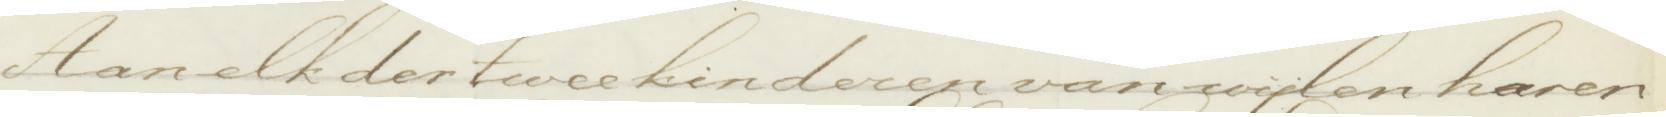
Aan elk der twee kinderen van wijlen haren
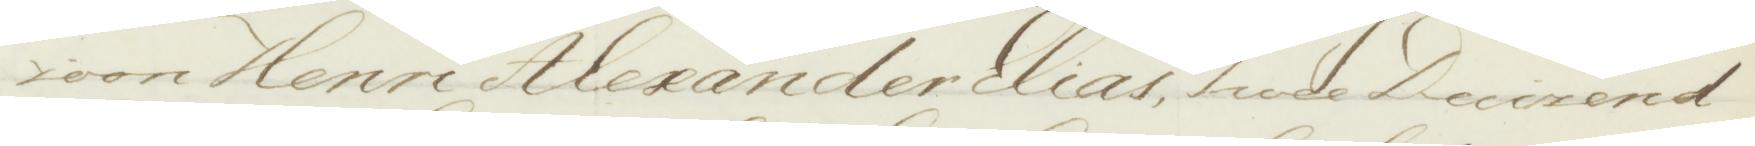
zoon Henri Alexander Elias, Twee Duizend
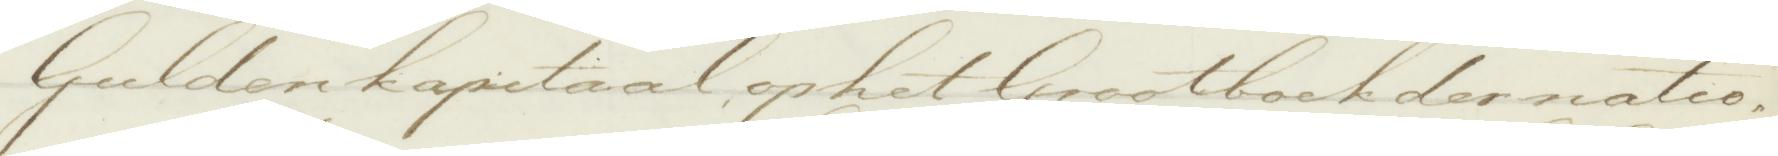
Gulden kapitaal, op het Grootboek der natio„
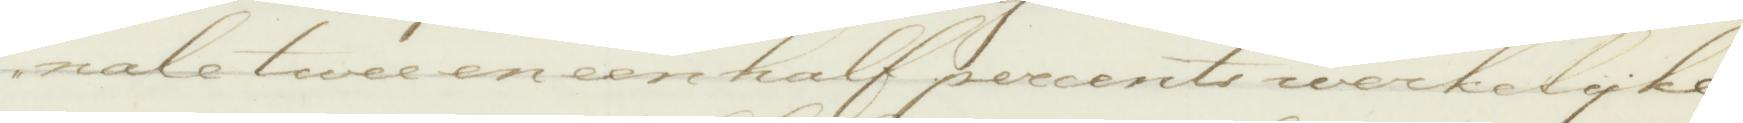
„nale twee en een half percents werkelijke
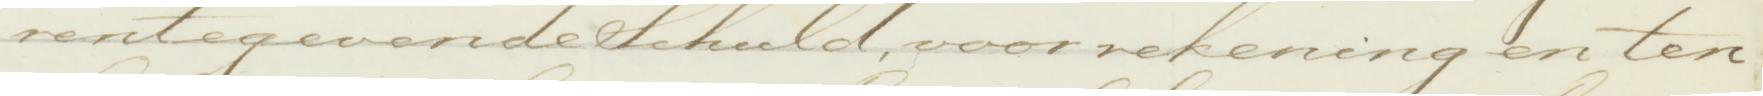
rentegevende schuld, voor rekening en ten
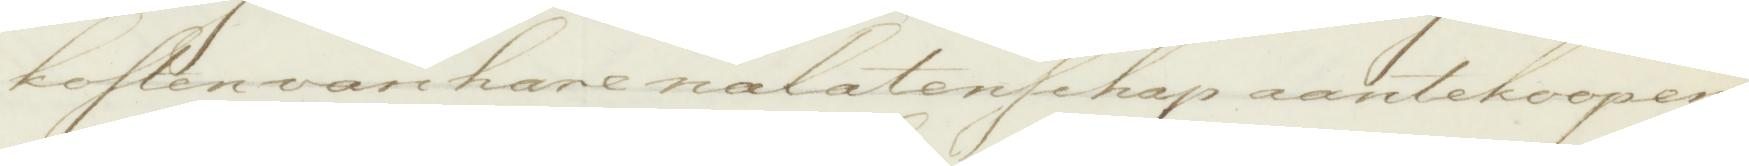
kosten van hare nalatenschap aantekoopen,
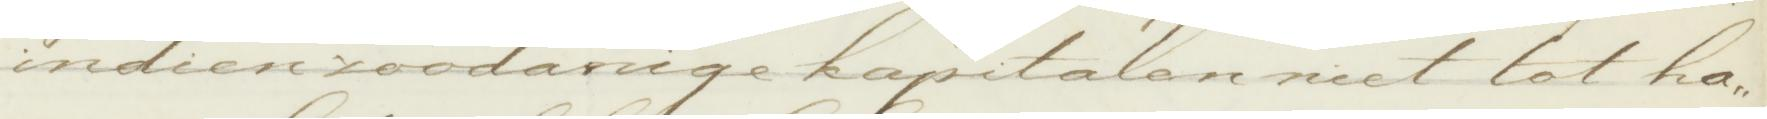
indien zoodanige kapitalen niet tot ha„
